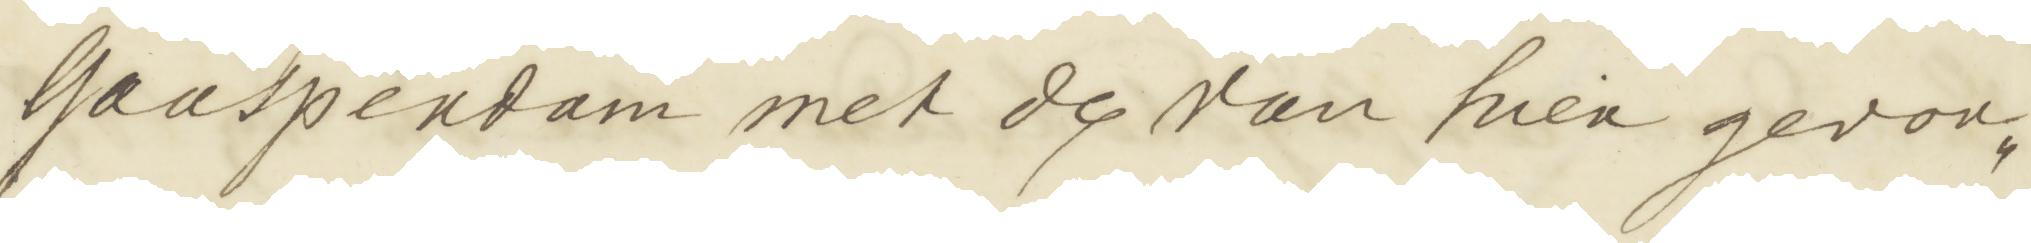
Gaasperdam met de van hier gevor„
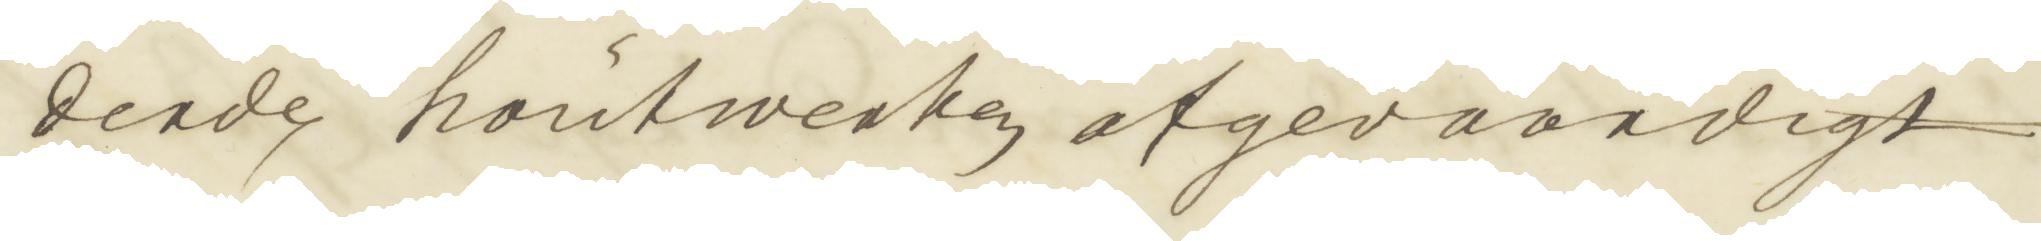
derde houtwerken afgevaardigt
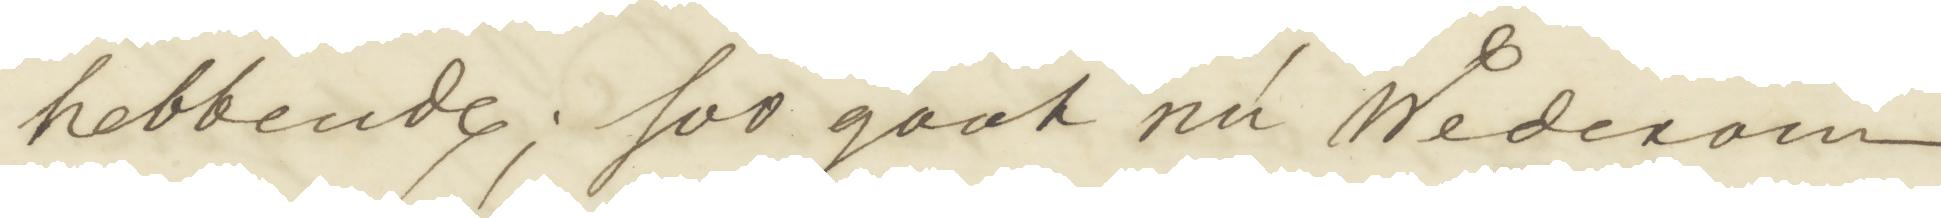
hebbende; soo gaat nu wederom
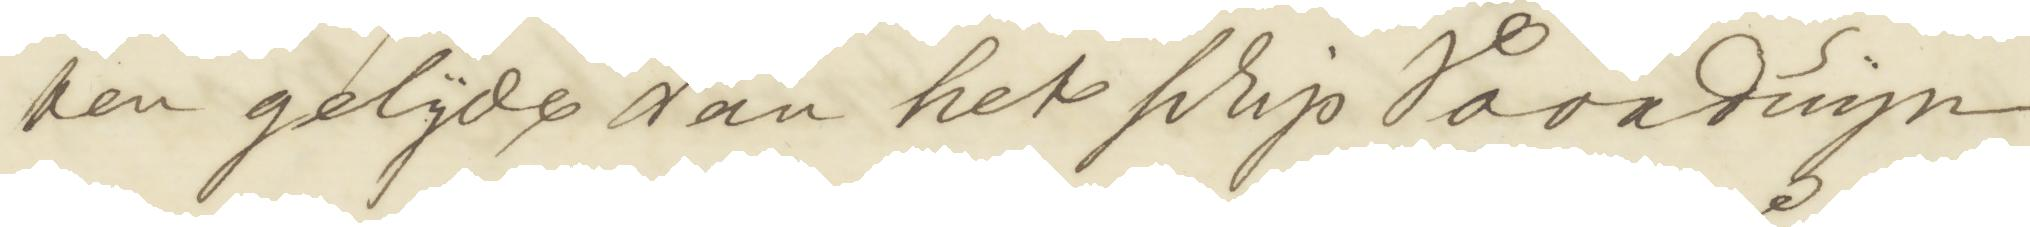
ten gelijde van het schip Voorduijn,
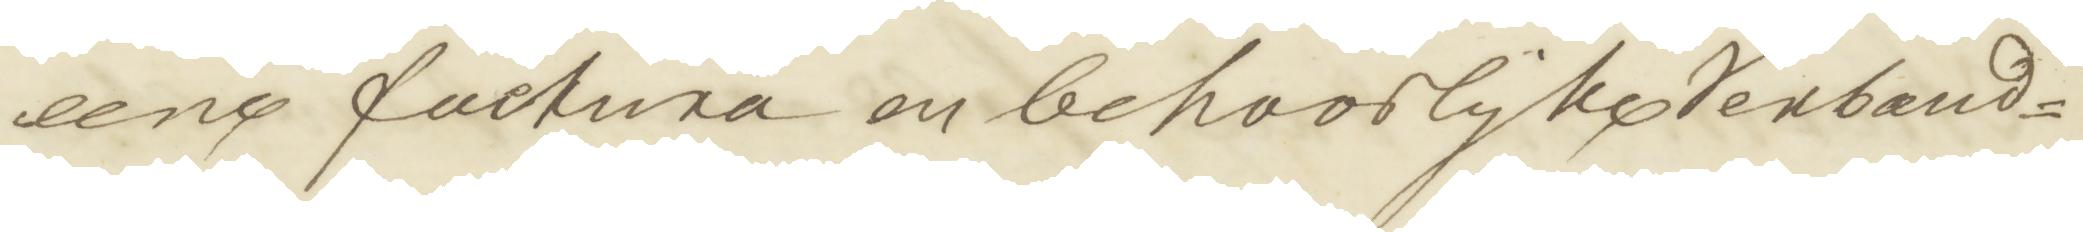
een factura en behoorlijke verband=
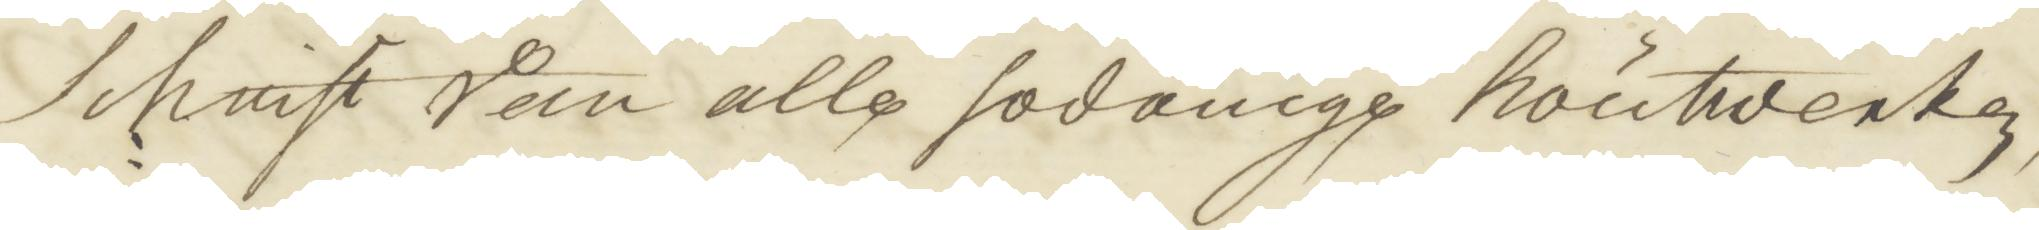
schrift van alle sodanige houtwerken
